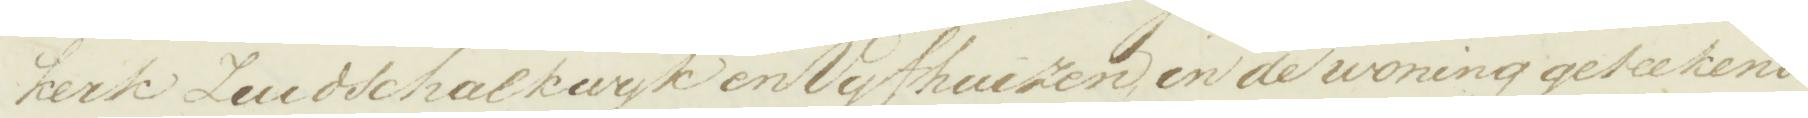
kerk Zuidschalkwyk en Vyfhuizen, in de woning geteekend
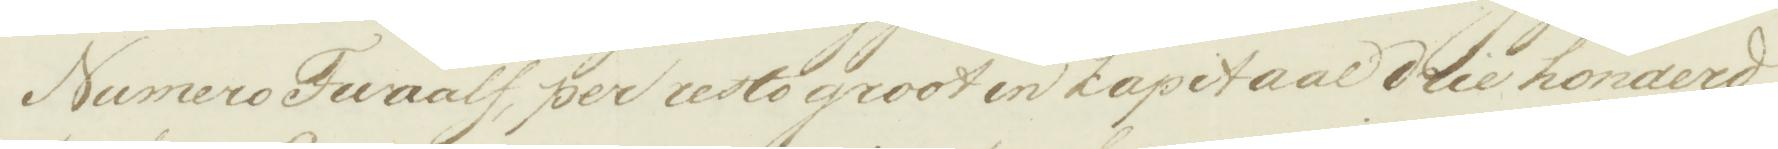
Numero Twaalf, per resto groot in kapitaal drie honderd
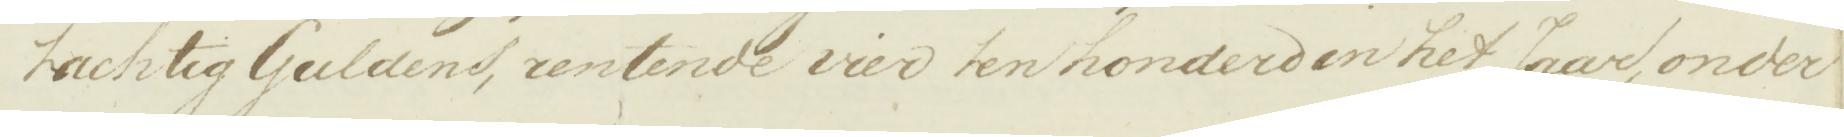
tachtig Guldens, rentende vier ten honderd in het Jaar, onder
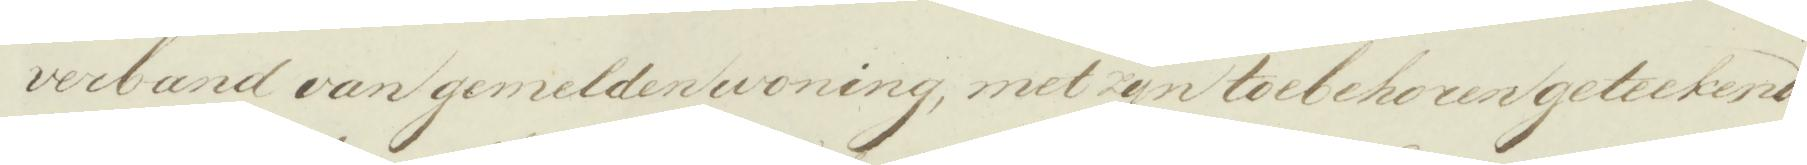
verband van gemelden woning, met zyn toebehoren geteekend
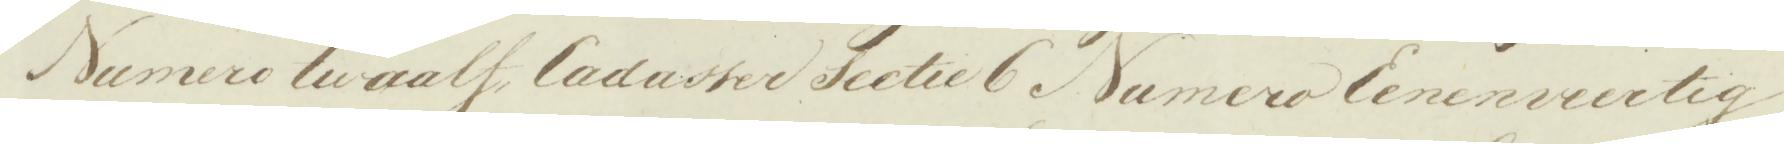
Numero twaalf, Cadaster sectie 6 Numero Eenenveertig
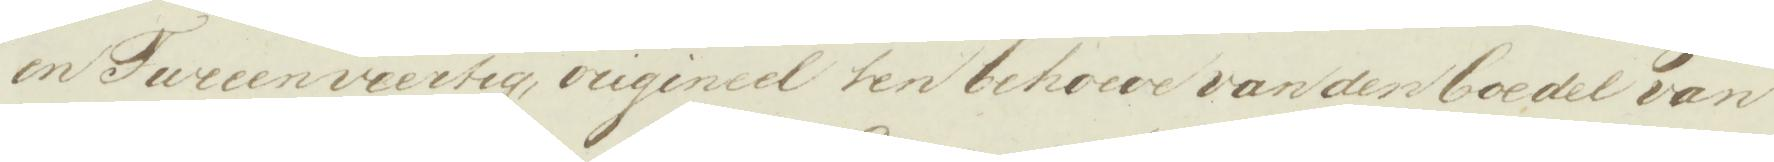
en Tweeenveertig, origineel ten behoeve van den boedel van
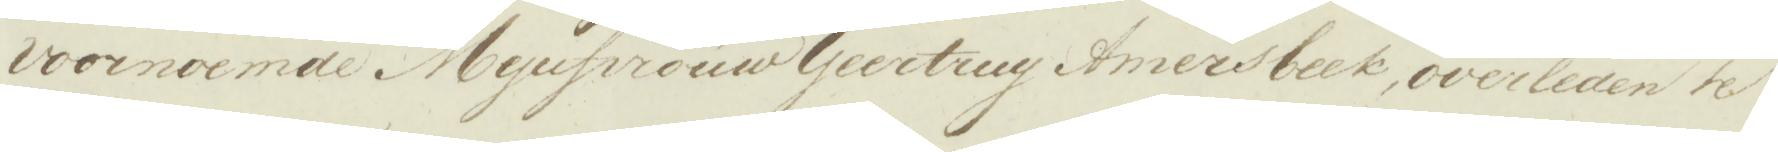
voornoemde Mejufvrouw Geertruy Amersbeek, overleden te
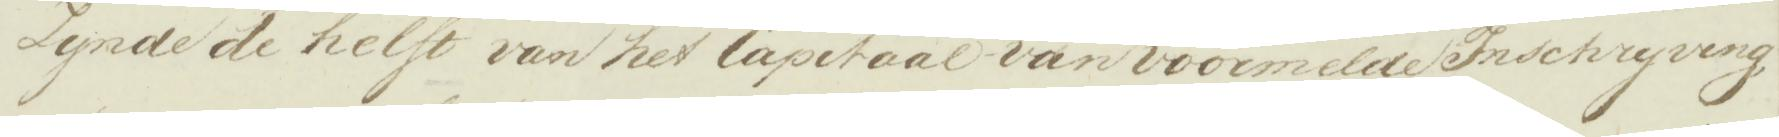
Zynde de helft van het Capitaal van voormelde Inschryving
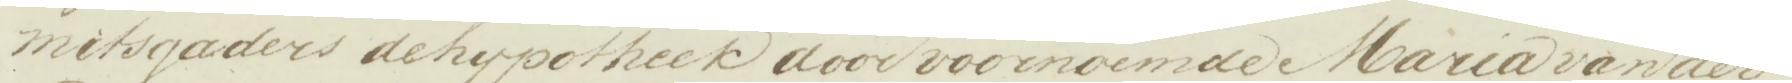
mitsgaders de hypotheek door voornoemde Maria van der
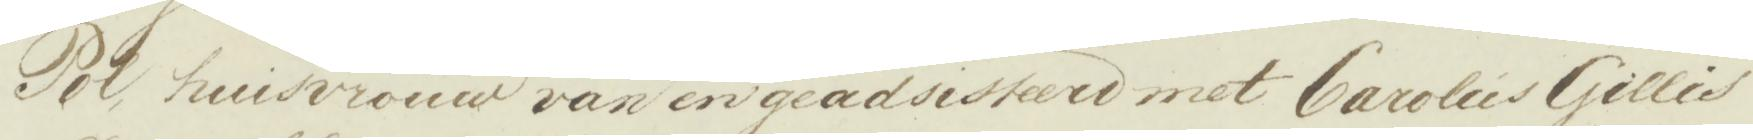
Pol, huisvrouw van en geadsisteerd met Carolus Gillis
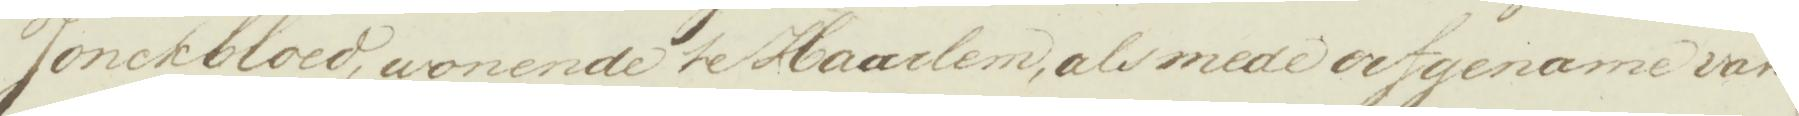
Jonckbloed, wonende te Haarlem, als mede erfgename van
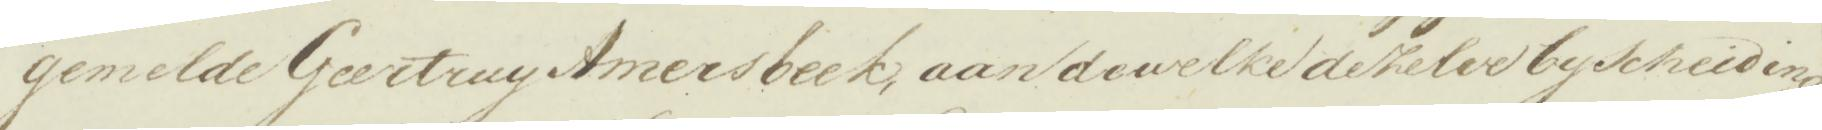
gemelde Geertruy Amersbeek, aan dewelke dezelve by scheiding
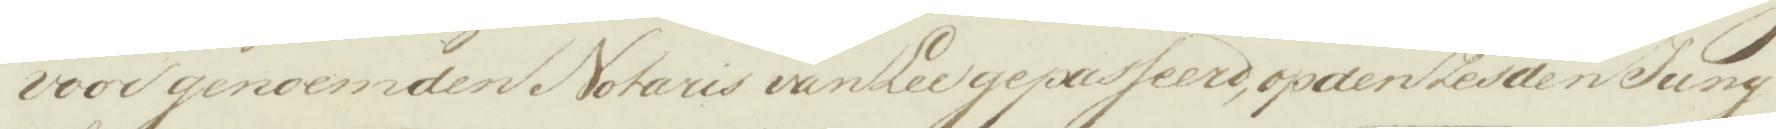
voor genoemden Notaris van Lee gepasseerd, op den zesden Iuny
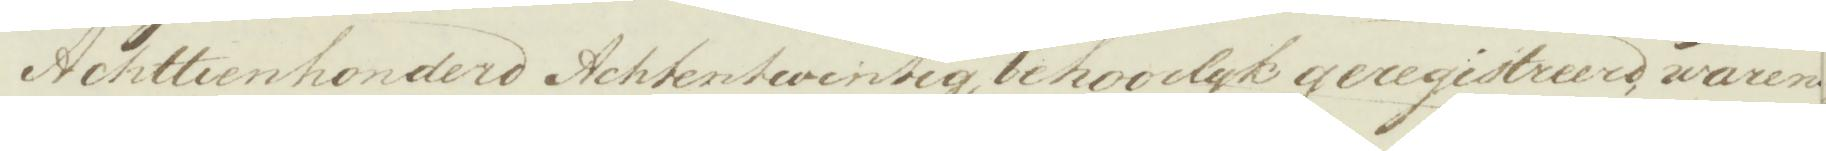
Achttienhonderd Achtentwintig, behoorlyk geregistreerd, waren
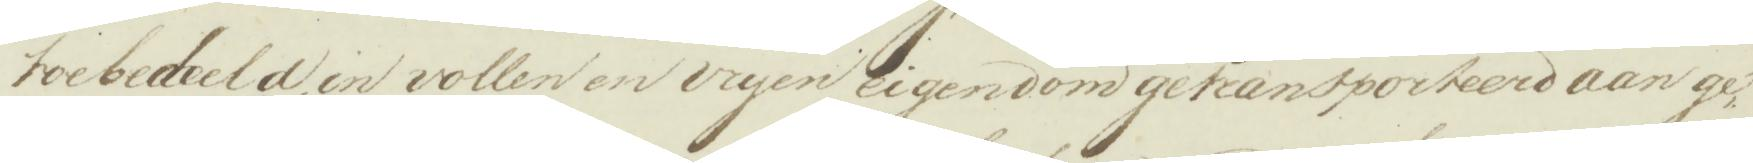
toebedeeld, in vollen en vryen Eigendom getransporteerd aan ge„
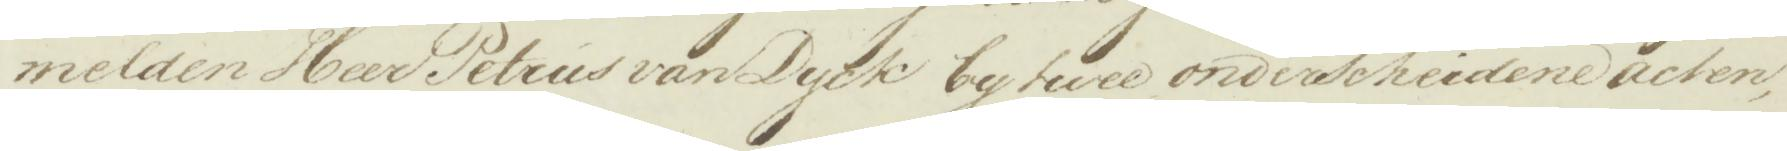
melden Heer Petrus van Dyck by twee onderscheidene acten,
